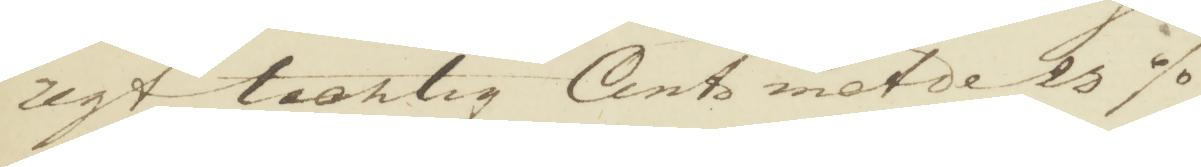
regt tachtig Cent met de 23 %
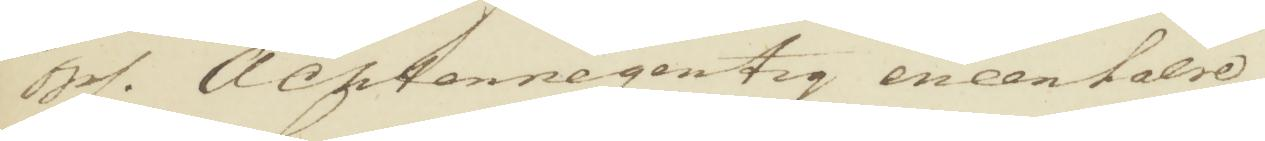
opC. Achtennegentig en een halve
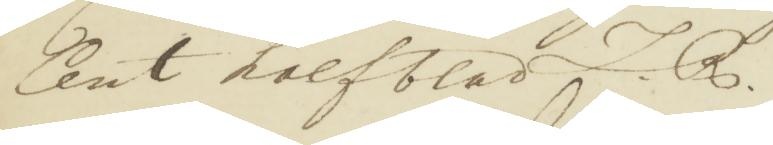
Cent half blad Z.R.
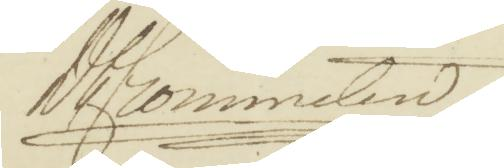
d,f Crommelin.
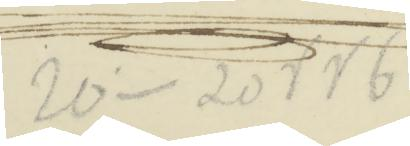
20 - 20116
